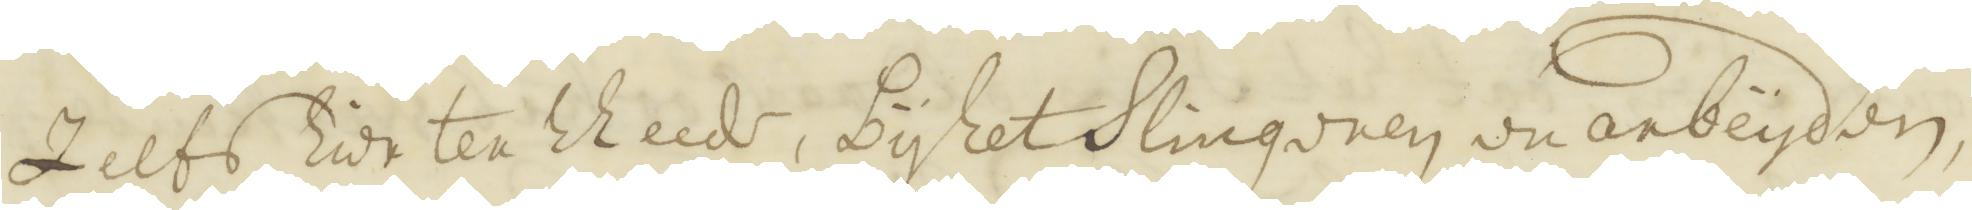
zelfs hier ter rheede, bij het slingeren en arbeijden
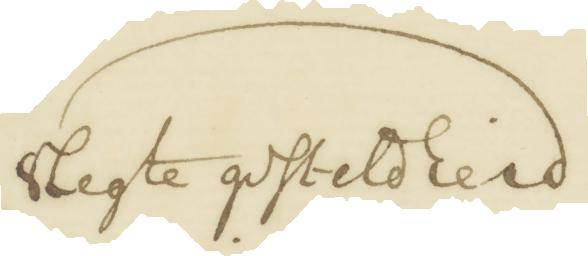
slegte gesteldheid
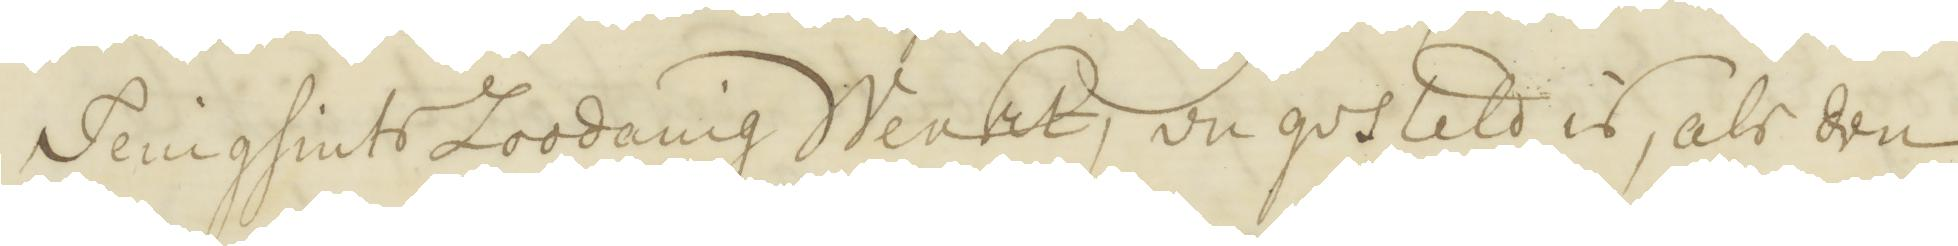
Eenigsints zoodanig werkt, en gesteld is, als den
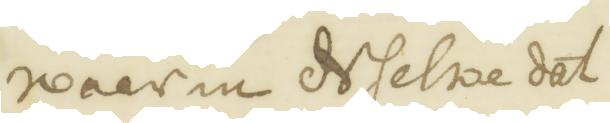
waer in deselve dat
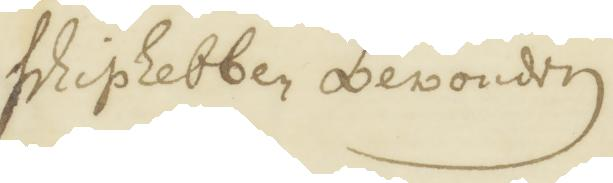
schip hebben bevonden.
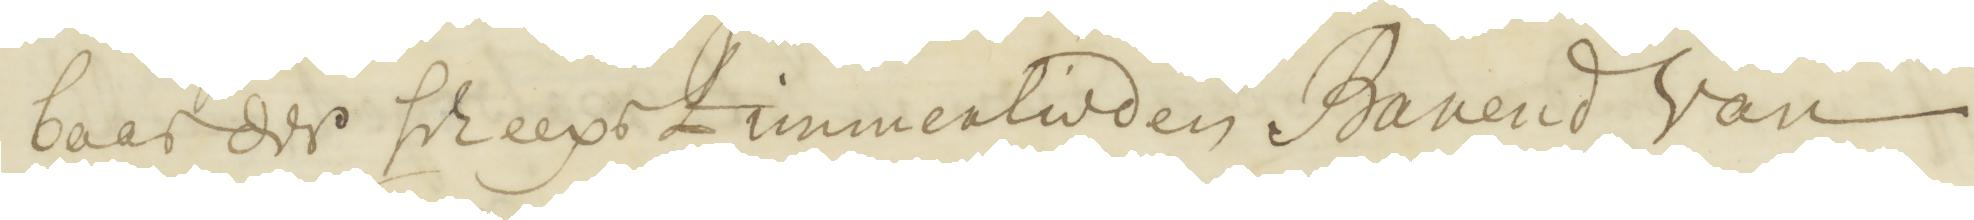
baas des scheeptimmerlieden Barend van
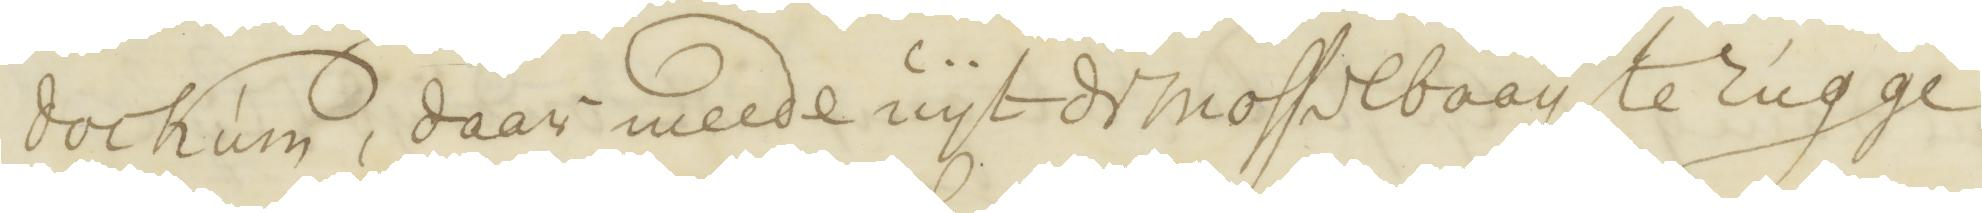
dockum, daar meede uijt de mosselbaaij te rugge
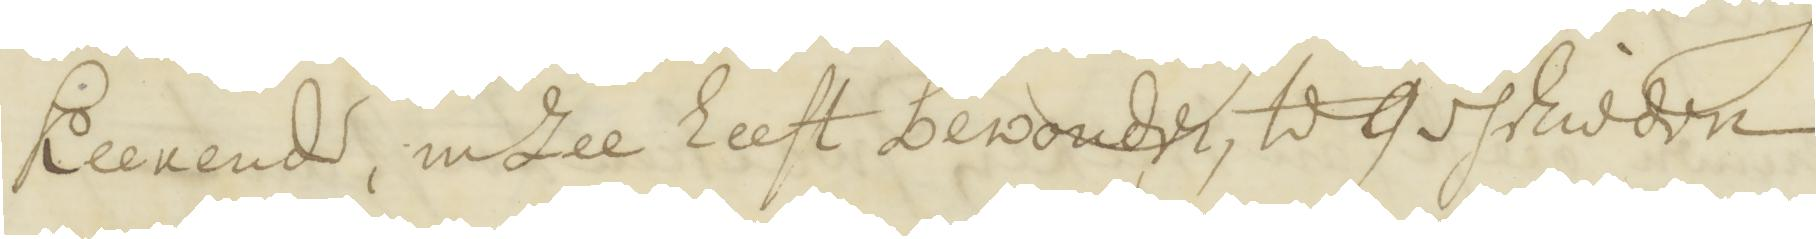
keerende, in zee heeft bevonden, te geschieden
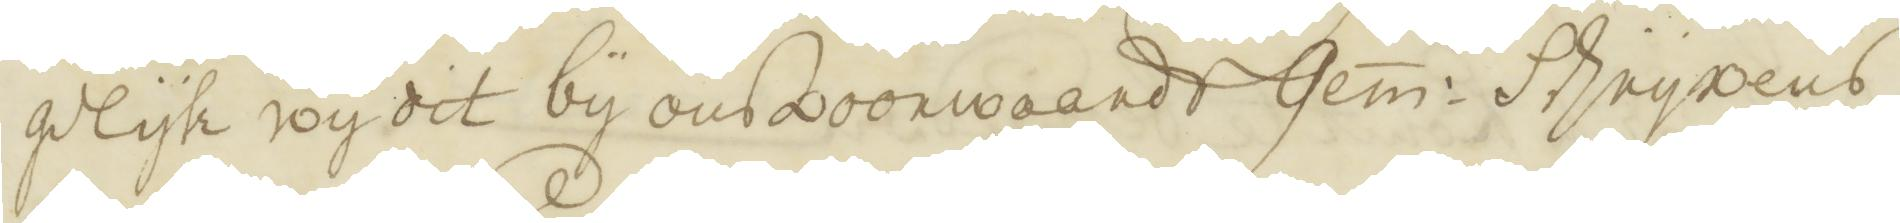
gelijk wij dit bij ons voorwaards gem: schrijvens
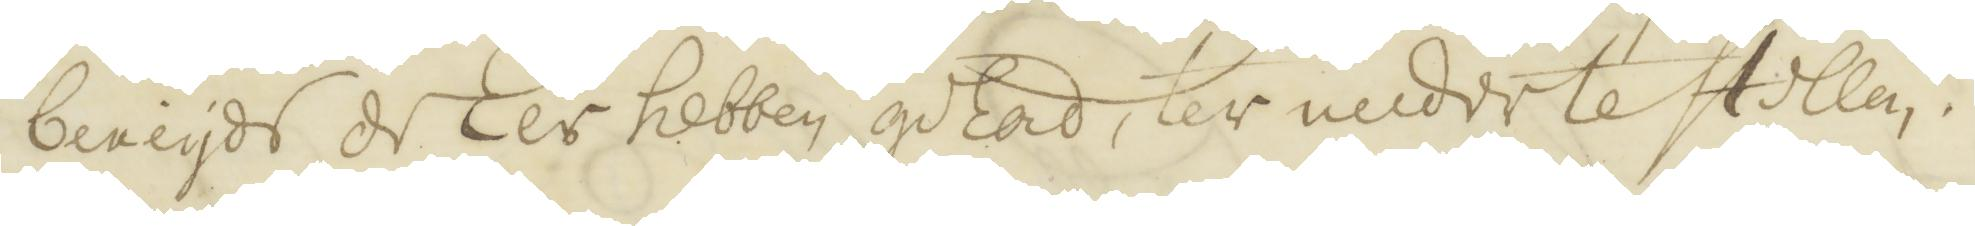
bereijds de Eer hebben gehad, ter needer te stellen.
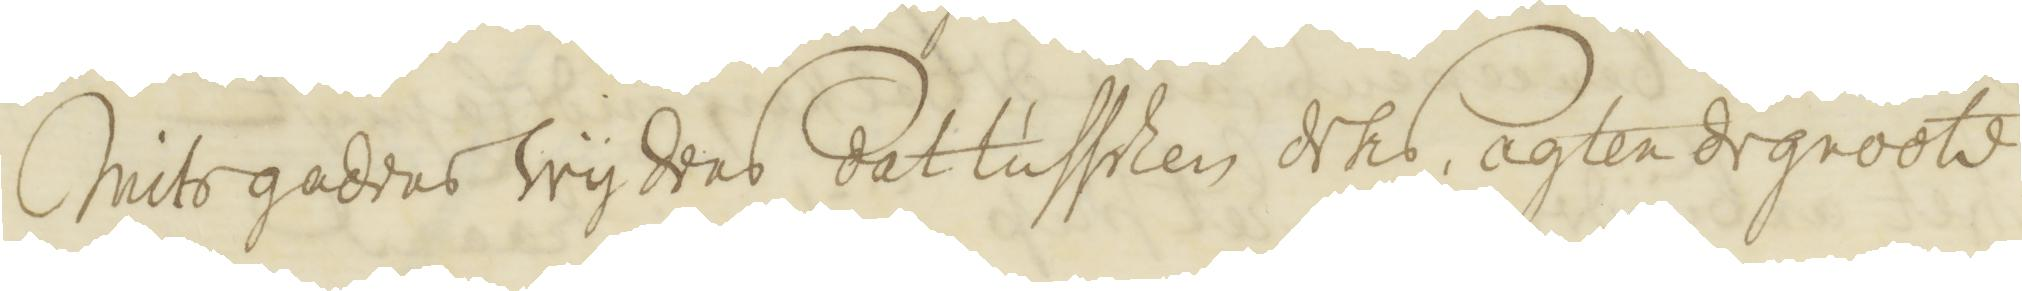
mitsgaders wijders dat tusschen deks, agter de groote
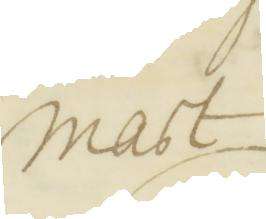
mast
